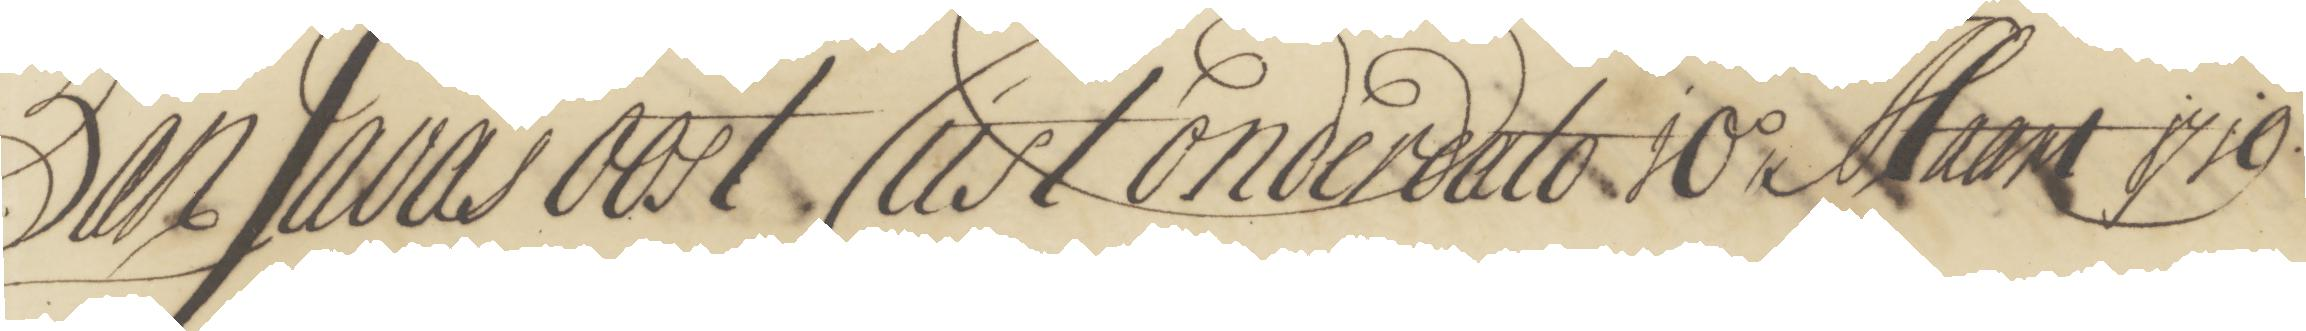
Van Java's oost Cust onder dato 10„e Maart 1719.
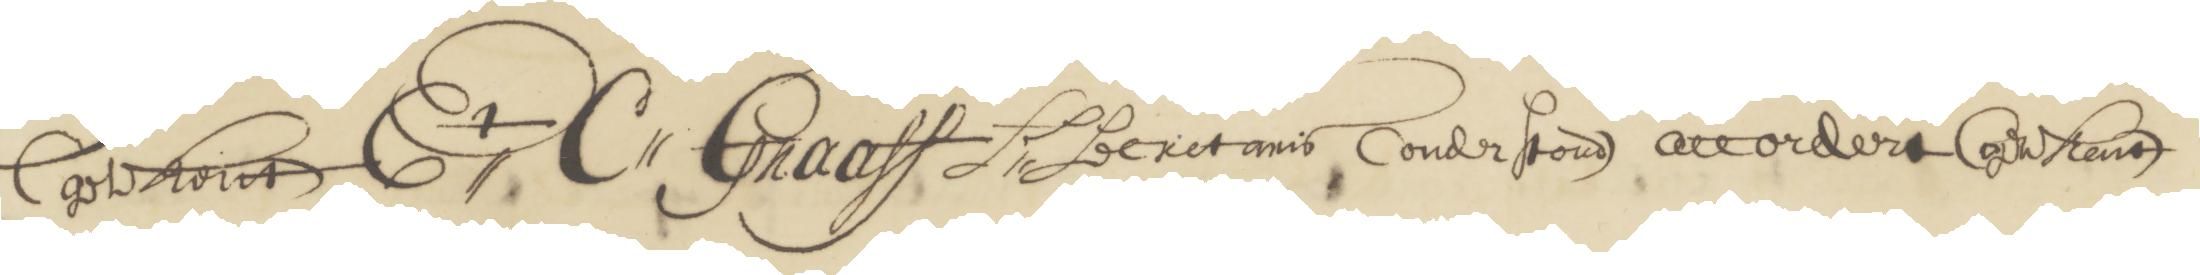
(getekent) E„t C„s Graaff S„s secretaris (onderstond) accordert (getekent)
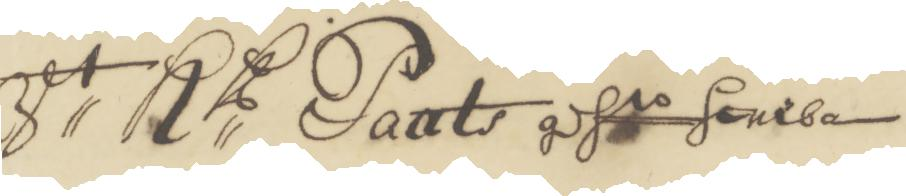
V„t H„k Paats ges=w scriba
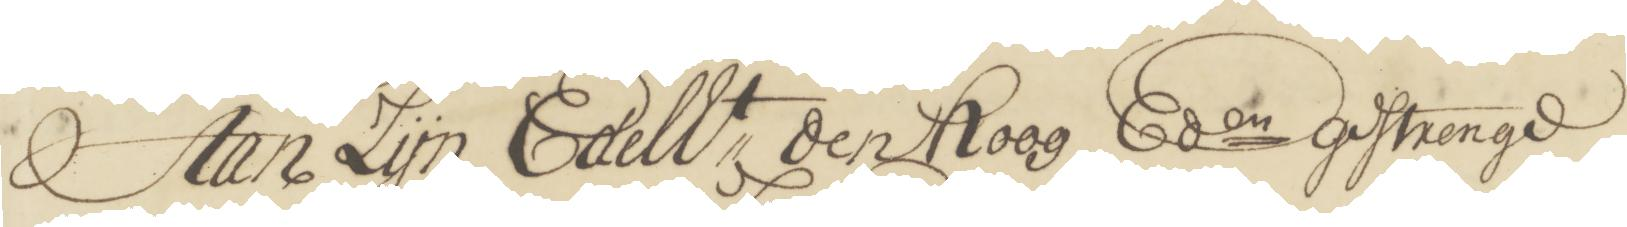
Aan Zijn Edelh„t den Hoog Ed=en gestrenge
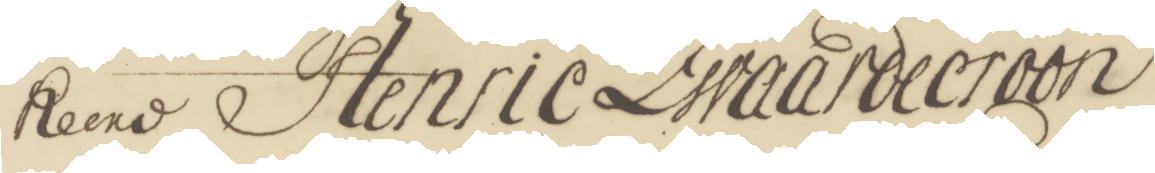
Heere Henric Zwaardecroon
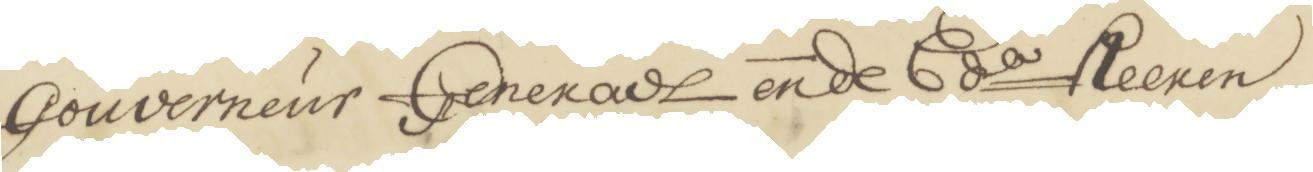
Gouverneur Generael ende Ed=le Heeren
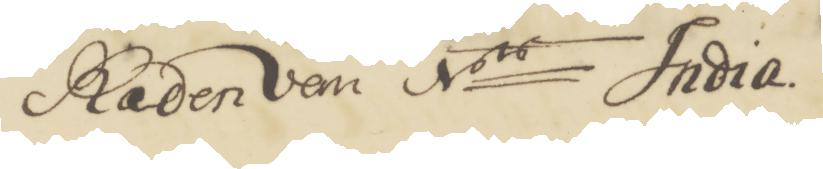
Raden van N=ts Jndia.
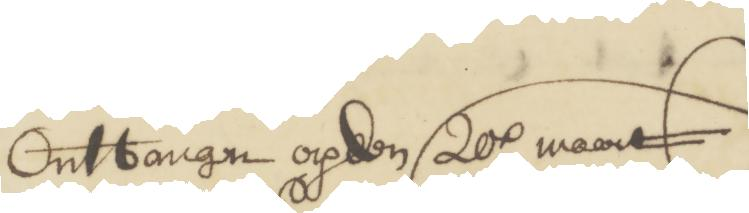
Ontvangen op den 20„e maart
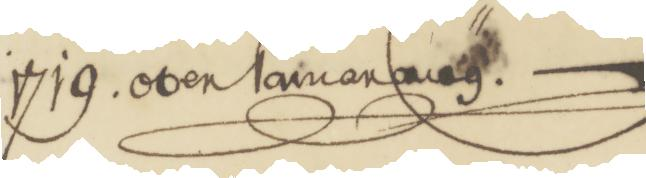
1719. over Samarang. —
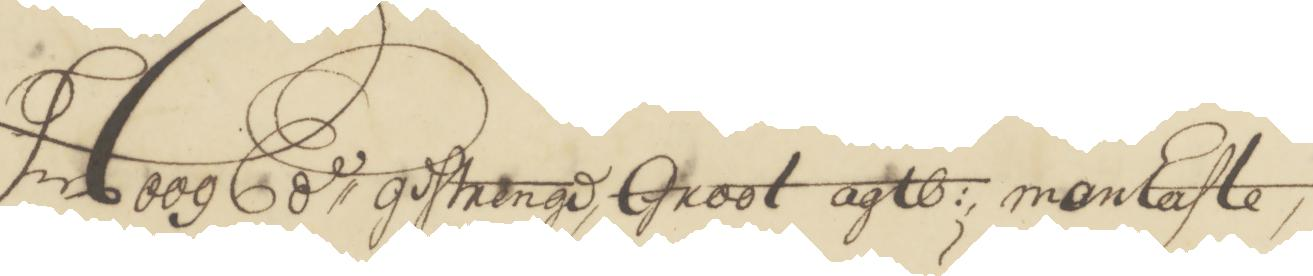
Hoog Ed„e gestrenge, Groot agtb:, manhafte,
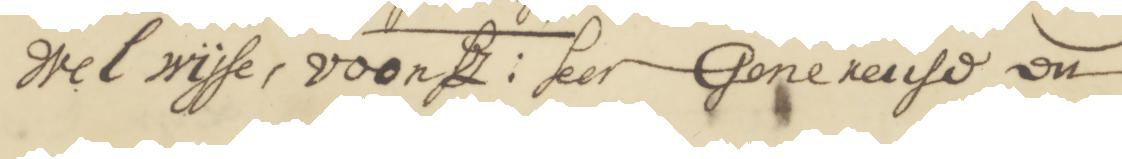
wel wijse, voorsz: seer Genereuse en
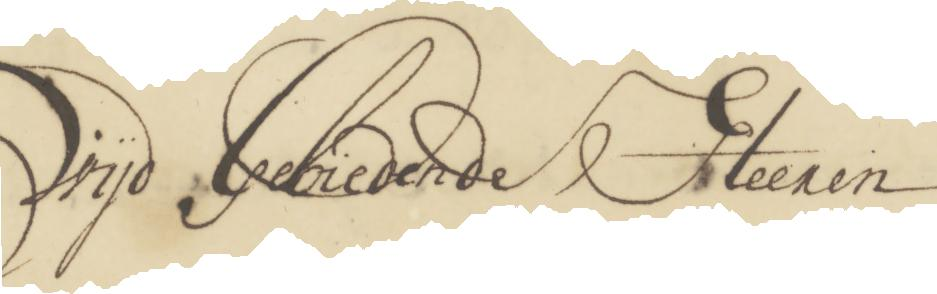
Wijd Gebiedende Heeren
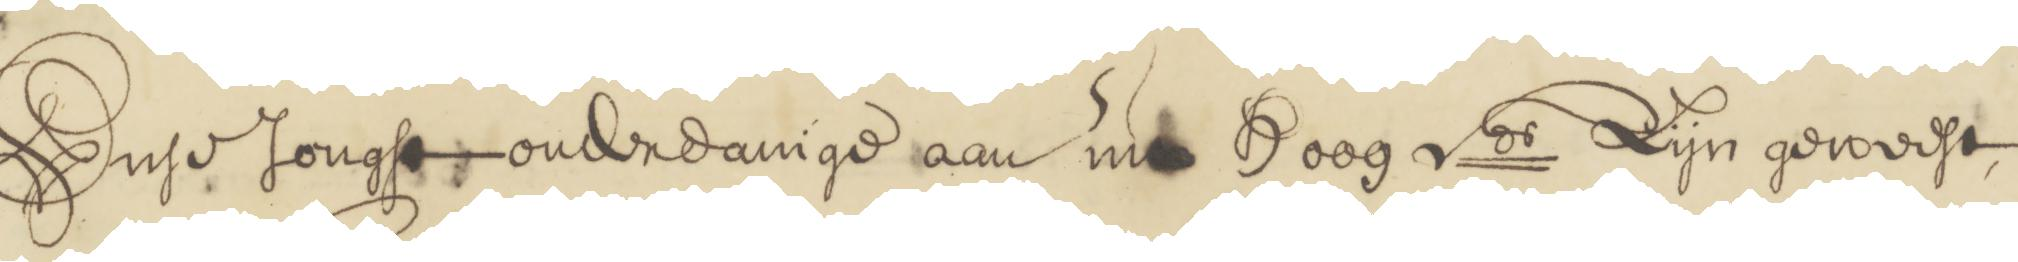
Onse Jongst onderdanige aan uw Hoog Ed=s Zijn geweest,
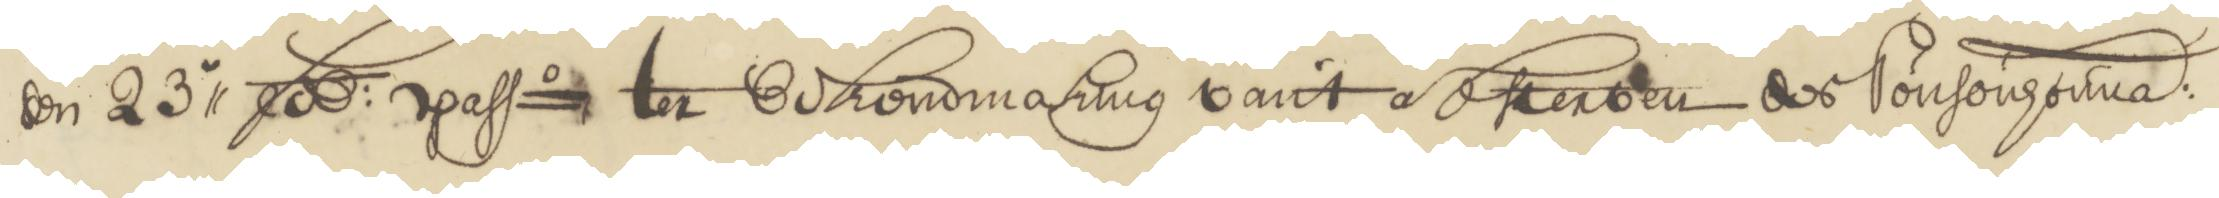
den 23„e feb: pass=o ter bekendmaking van’t afsterven des Sousouhouna:'
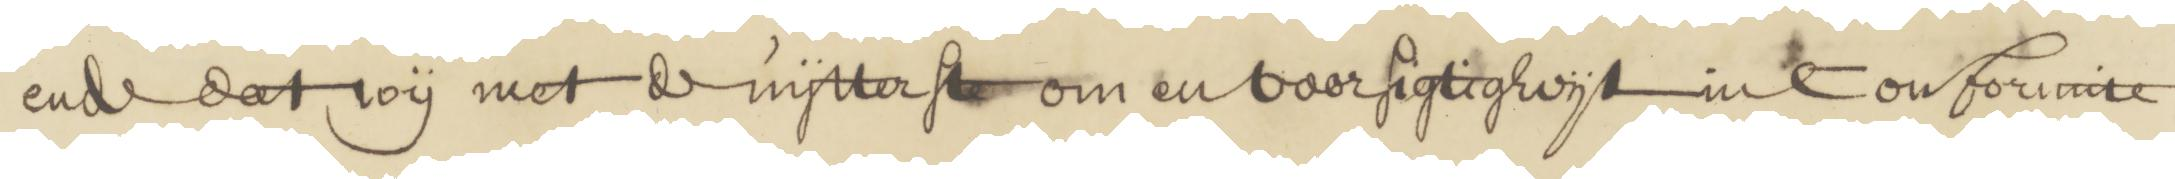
ende dat wij met de uijtterst om en voorsigtigheijt in conformite
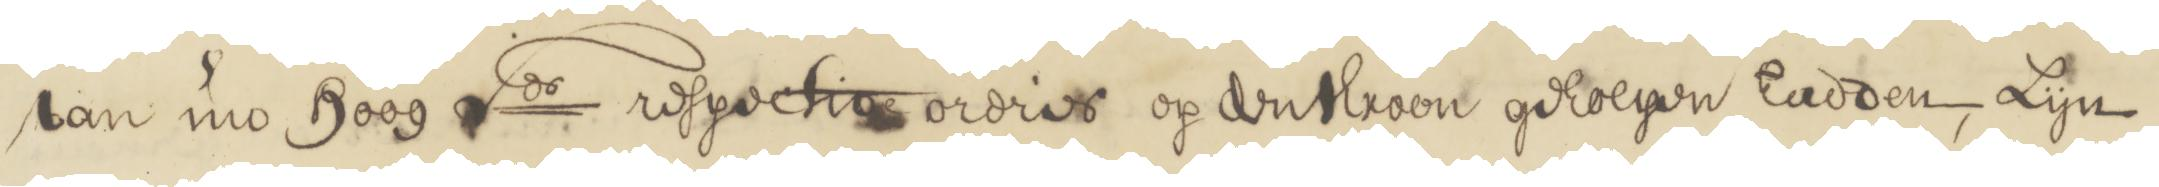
van uw Hoog E=es respective ordres op den throon geholpen hadden, Zijn
